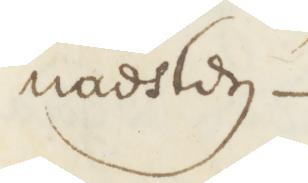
naesten _
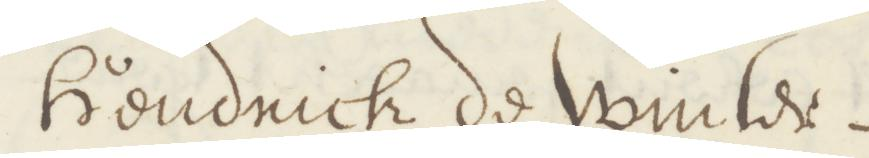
S:r hendrick de winter
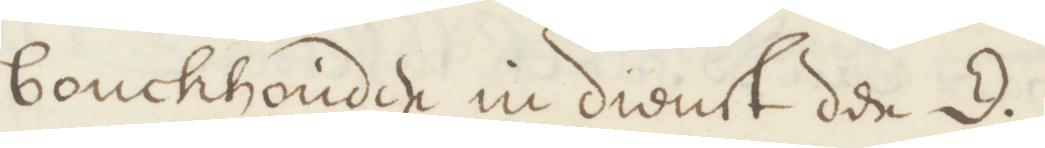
bouckhouder in dienst der E.
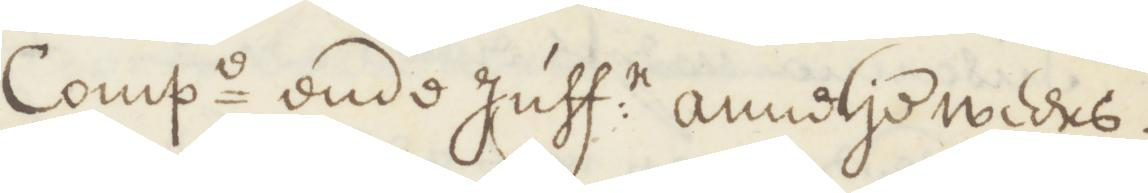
Comp=e ende Juff:r annetje weers
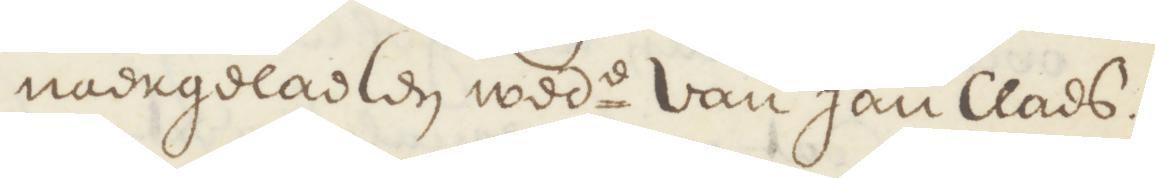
naergelaeten wed=e van Jan Claes.
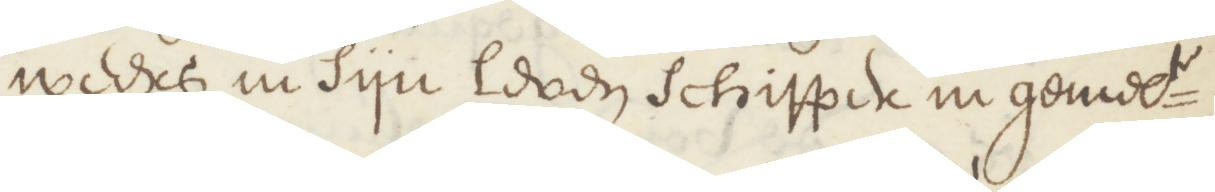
weers in sijn leven schipper in gemel=te
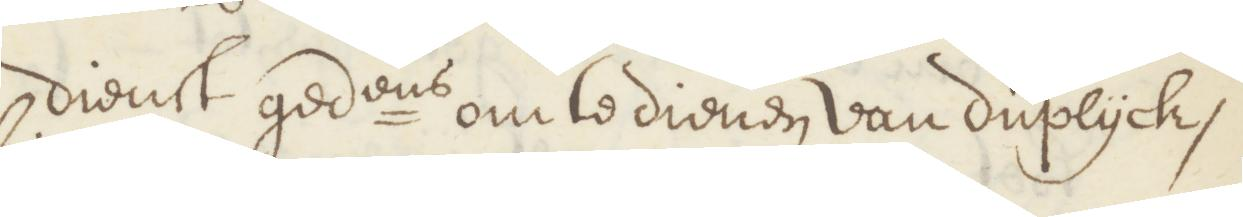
dienst ged=ens om te dienen van duplijck,
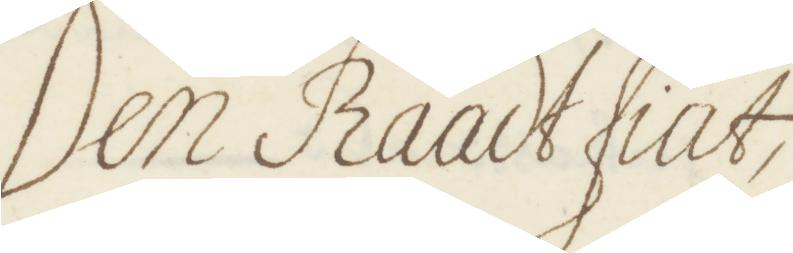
Den Raadt fiat,
